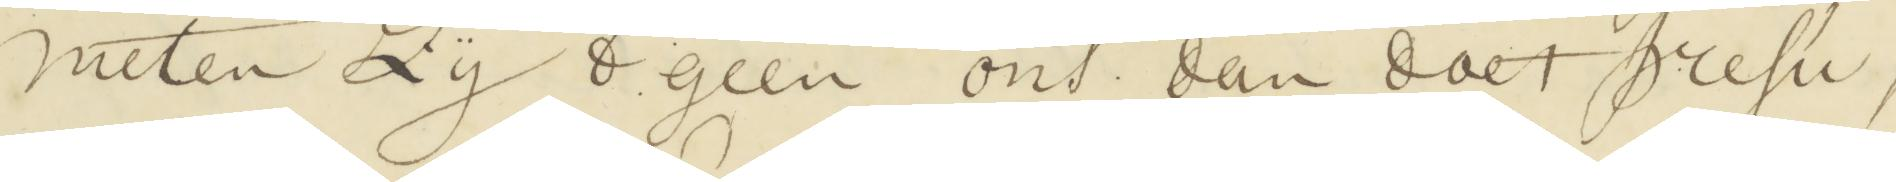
meten Zij t: geen ons dan doet presu
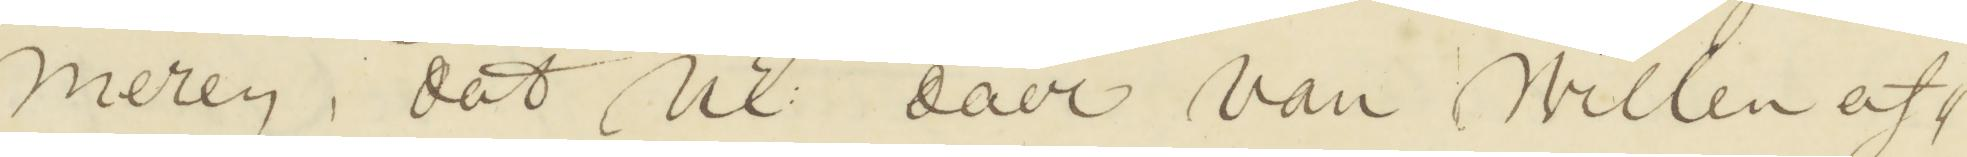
meren; dat UE: daer van Willen af„
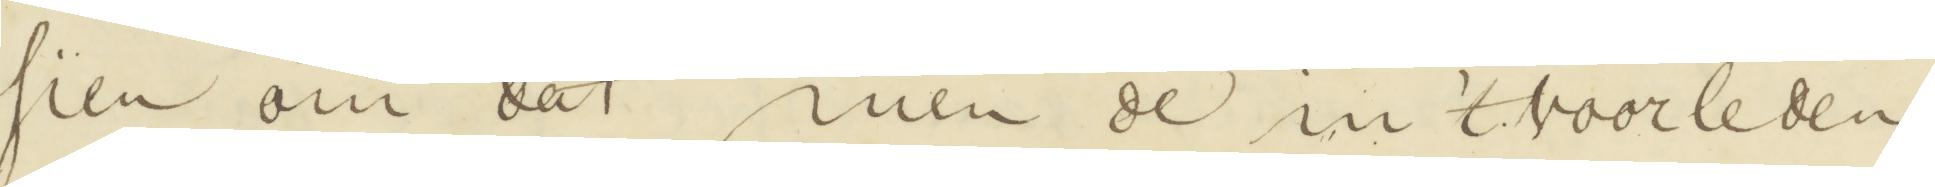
sien om dat men de in ’t voorleden
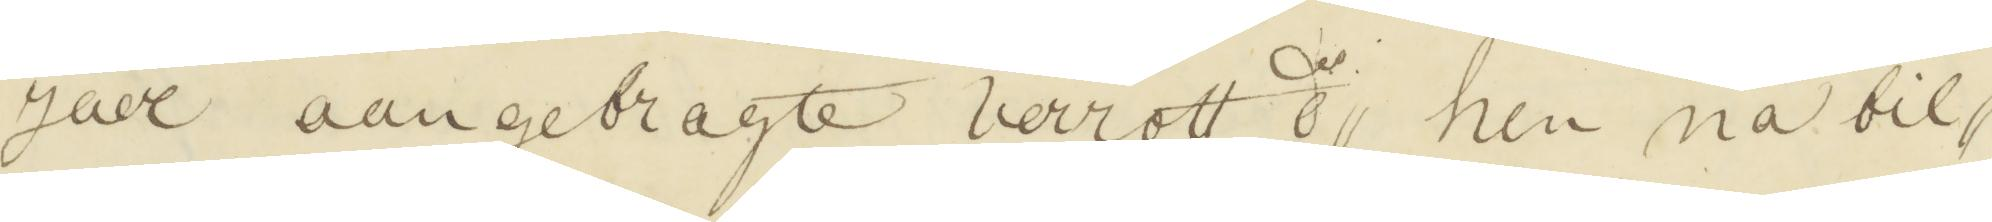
jaer aangebragte verrott d„e hen na bil„
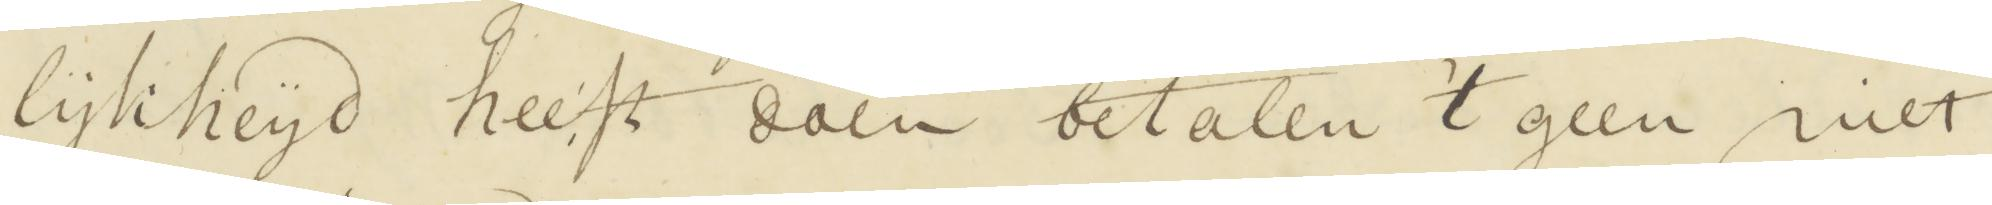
lijkheijd heeft doen betalen ’t geen niet
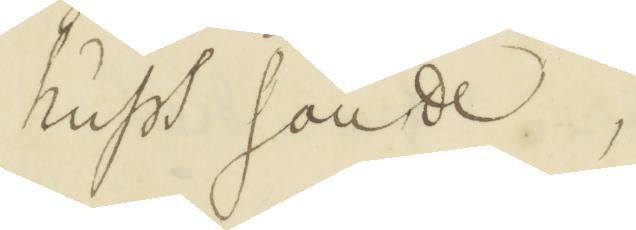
hups soude,
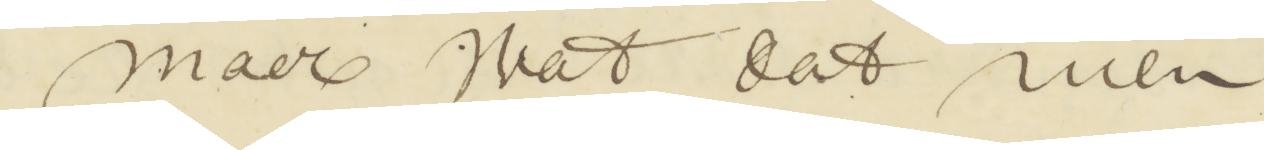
maer Wat dat men
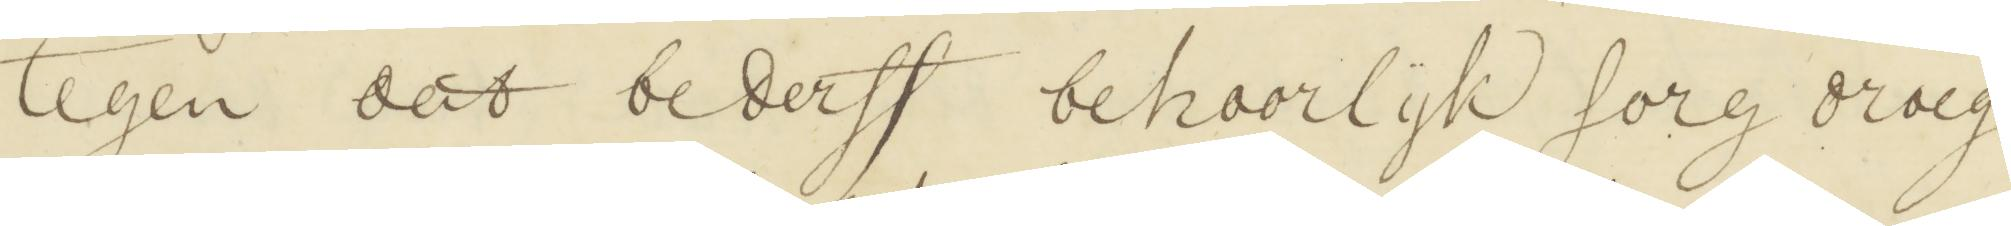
tegen dat bederff behoorlijk sorg droeg
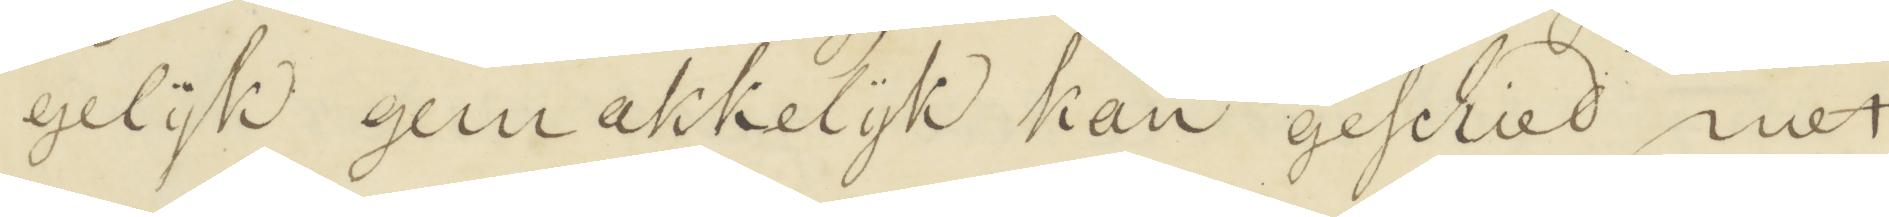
gelijk gemakkelijk kan geschied met
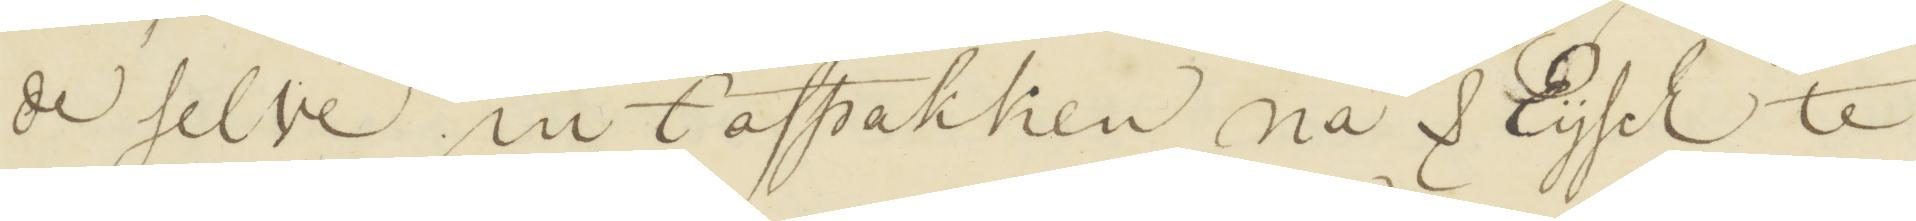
de selve in taspakken na vereijsch te
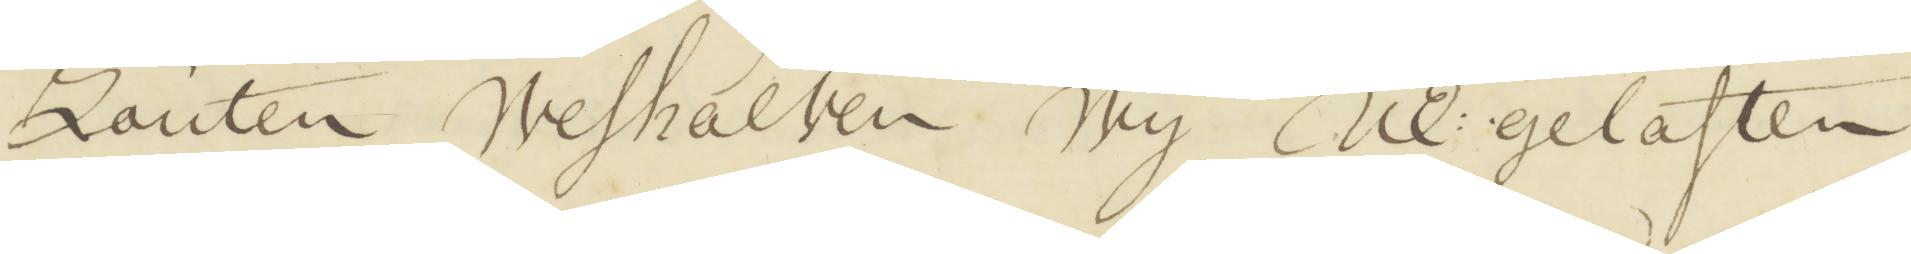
Zouten Weshalven Wij UE: gelasten
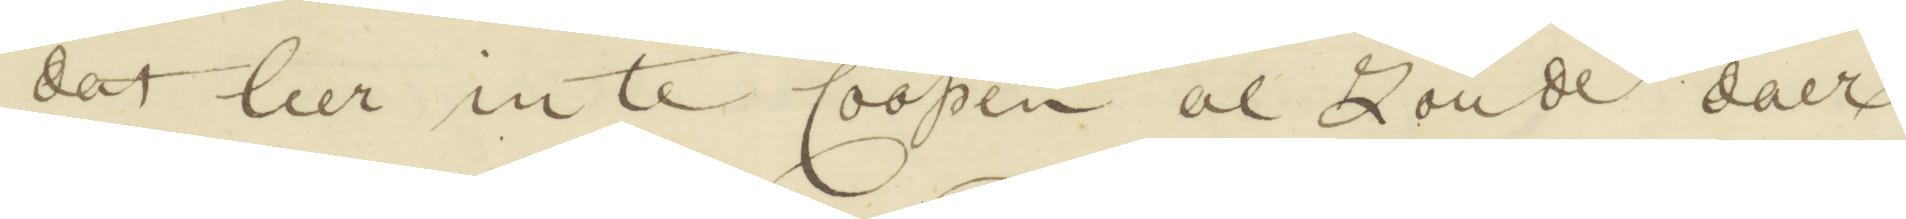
dat leer in te coopen al Zoude daer
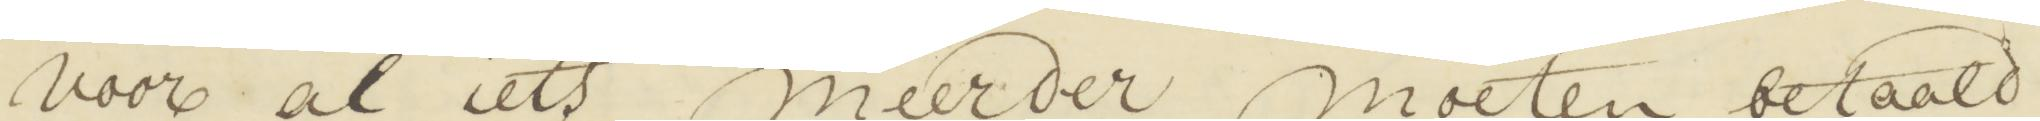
voor al iets meerder moeten betaald
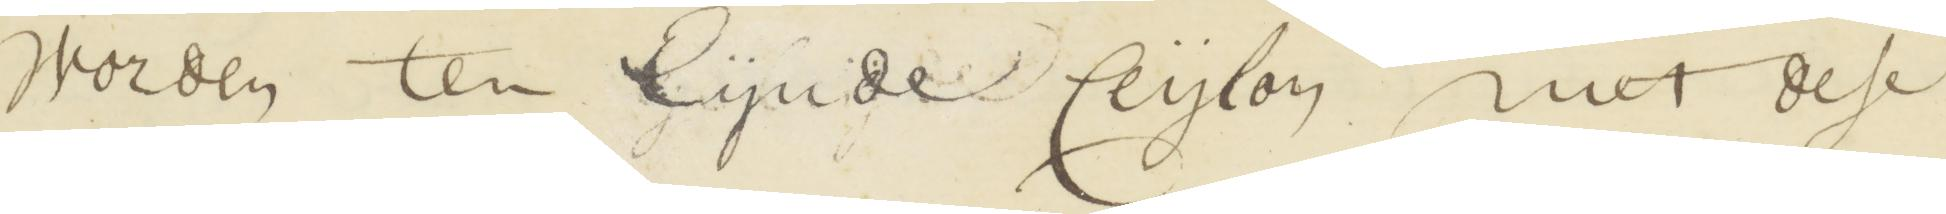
Worden ten Eijnde Ceijlon met dese
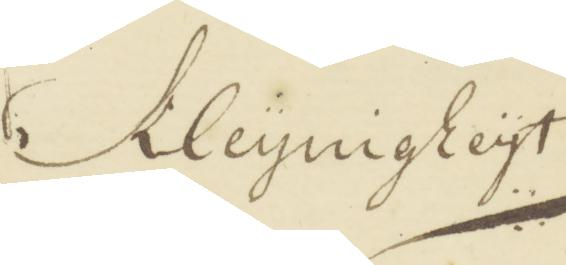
Kleijnigheijt
